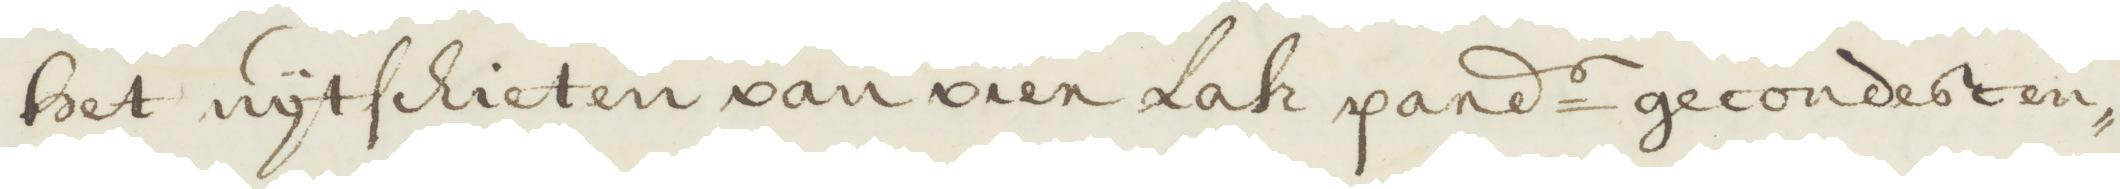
het uijtschieten van vier lak pard=s gecondescen„
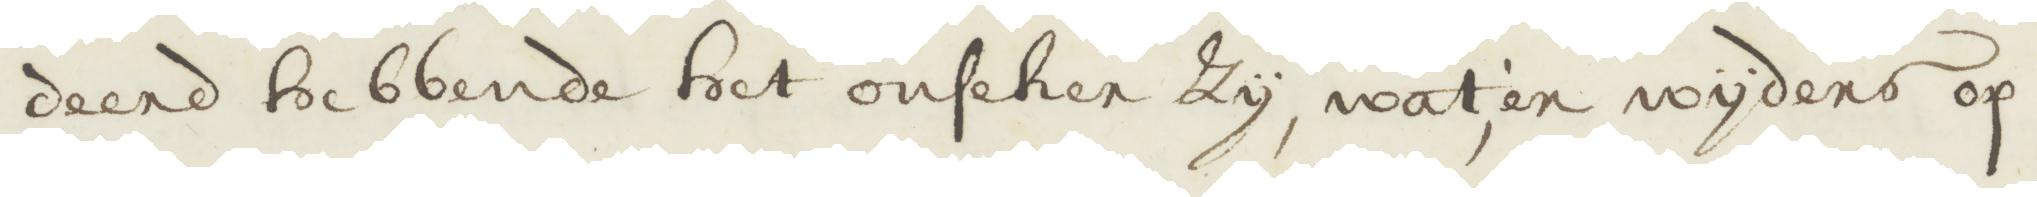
deerd hebbende het onseker zij, wat, er wijders op
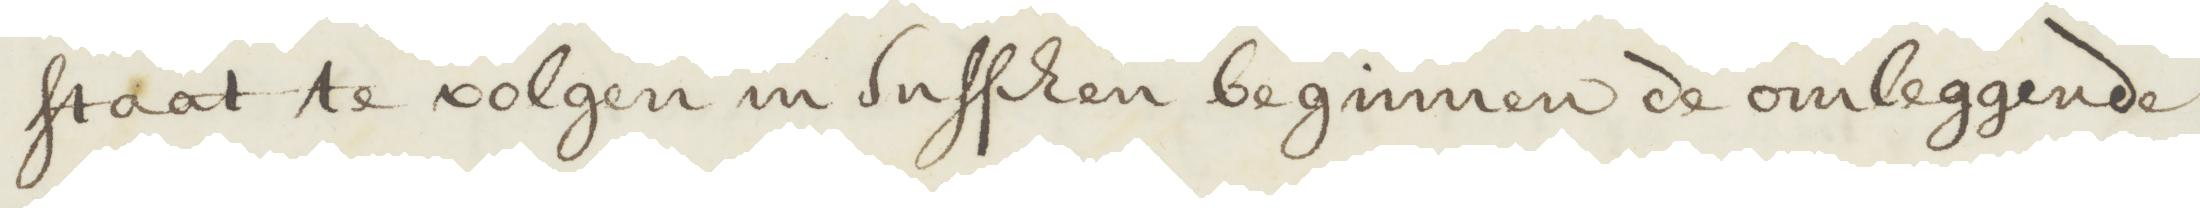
staat te volgen in tusschen beginnen de omleggende
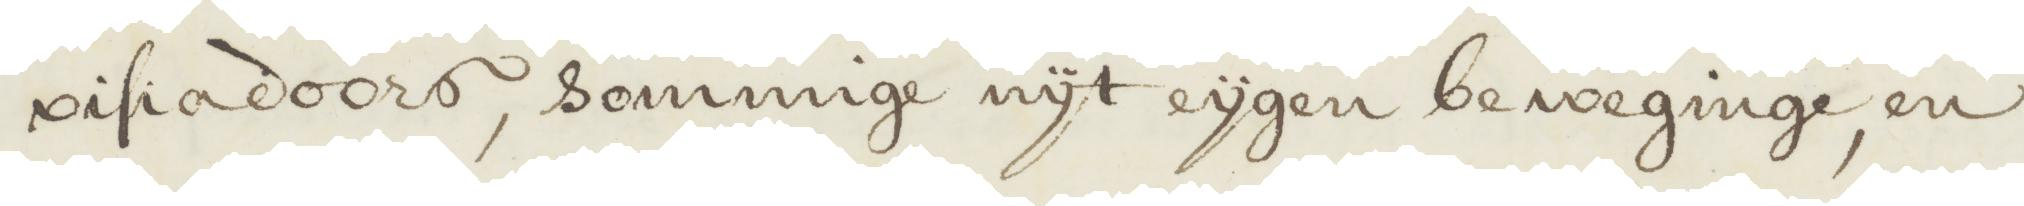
visiadoors, sommige uijt eijgen beweginge, en
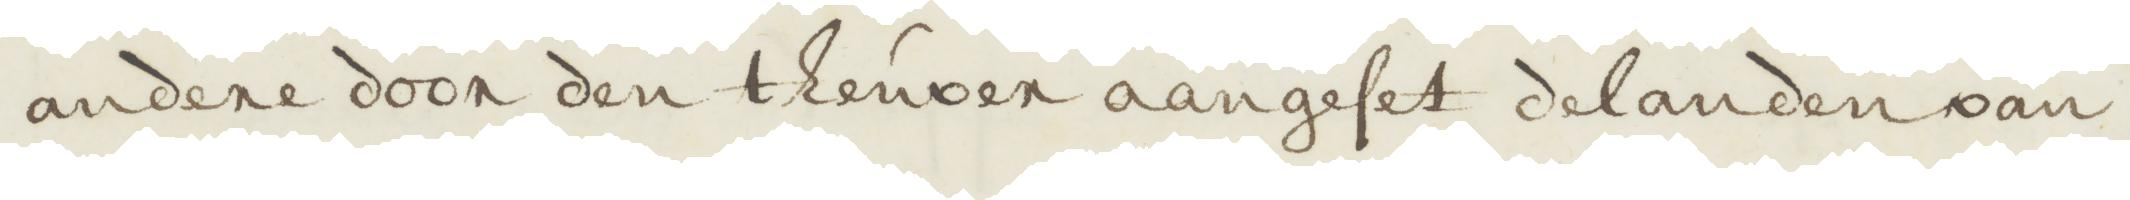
andere door den theuver aangeset, delanden van
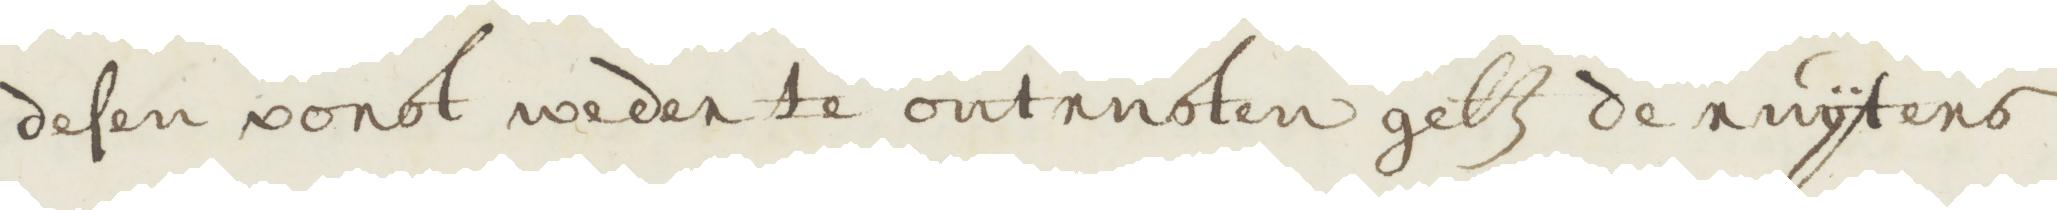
desen vorst weder te ontrusten gelijk de ruijters
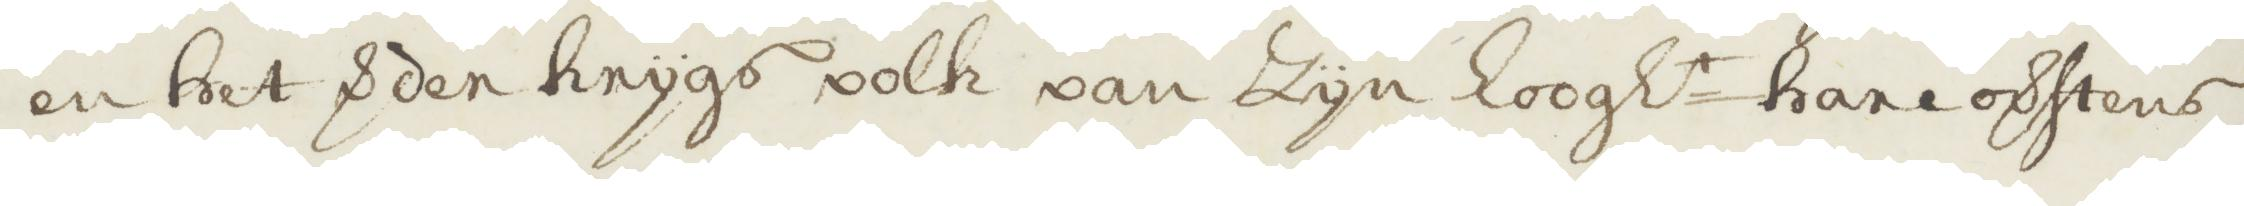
en het verder krijgs volk van zijn hoogh=t hare overstens
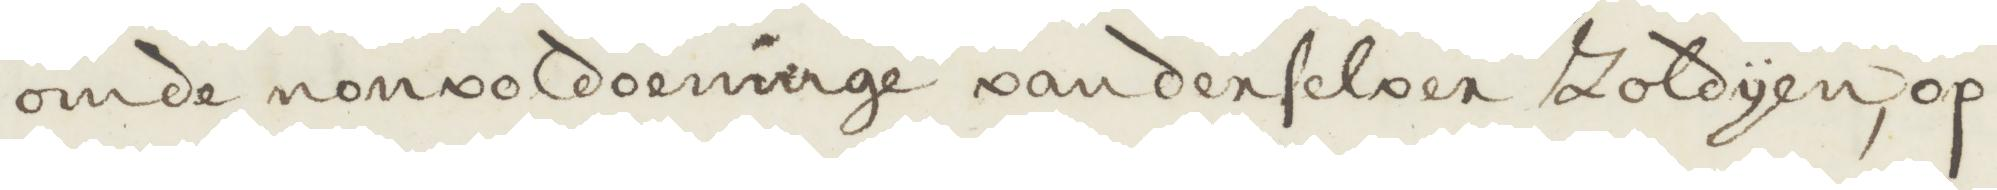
omde nonvoldoeninge van derselver zoldijen, op
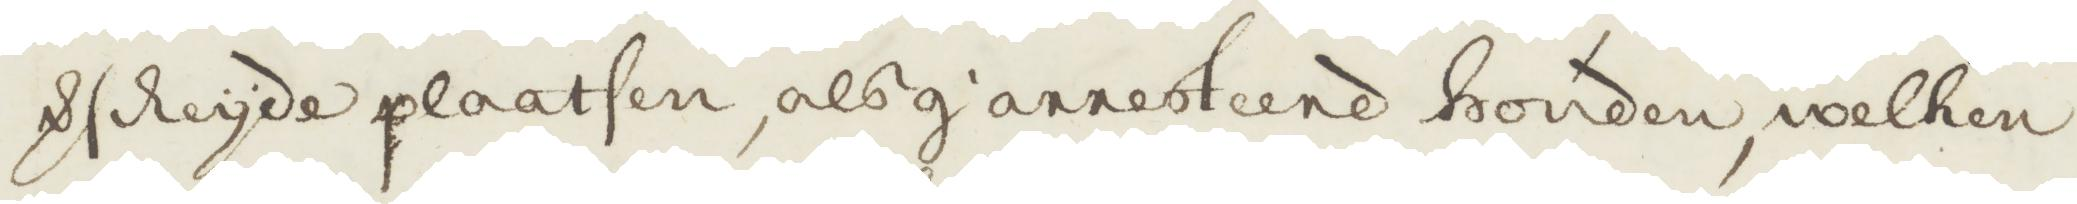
verscheijde plaatsen, als g’arresteerd houden, welken
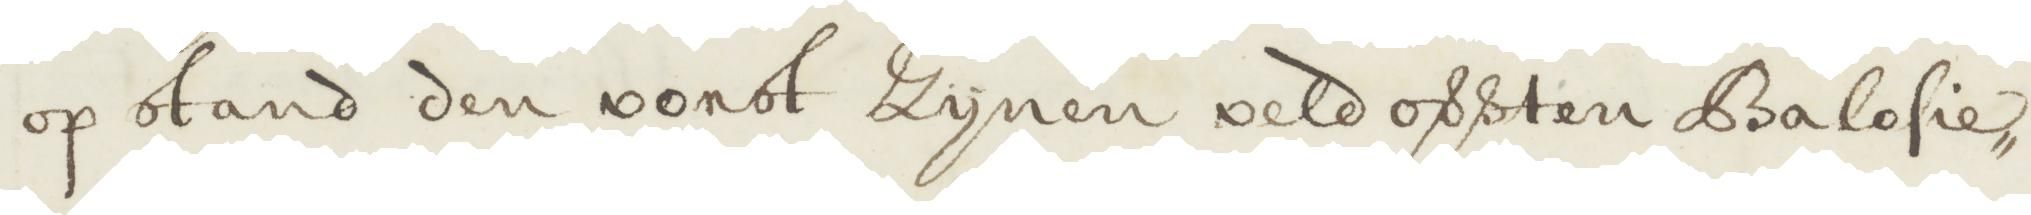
op stand den vorst zijnen veld oversten Balosie„
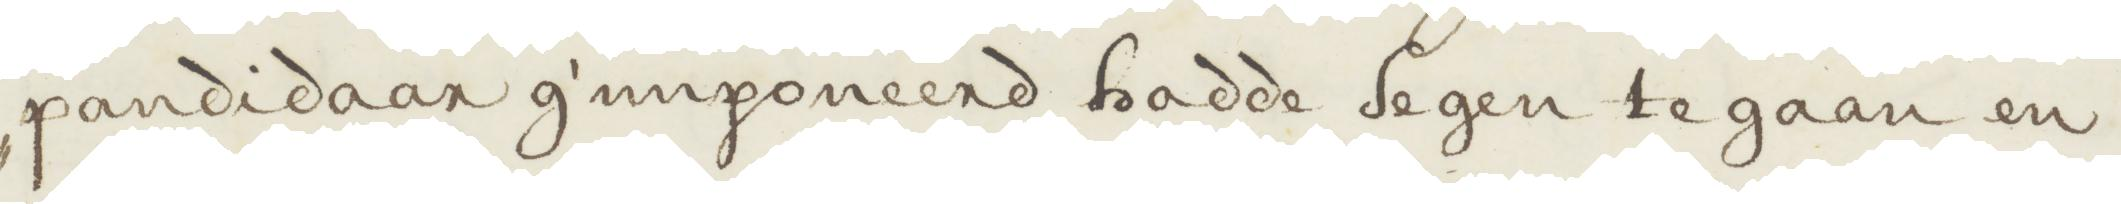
„pandidaar g’imponeerd hadde tegen te gaan, en
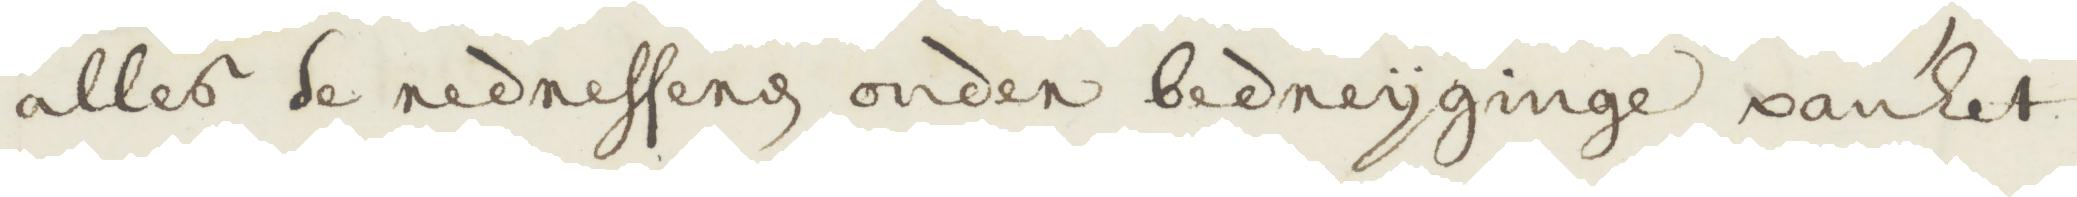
alles te redresseren, onder bedreijginge van het
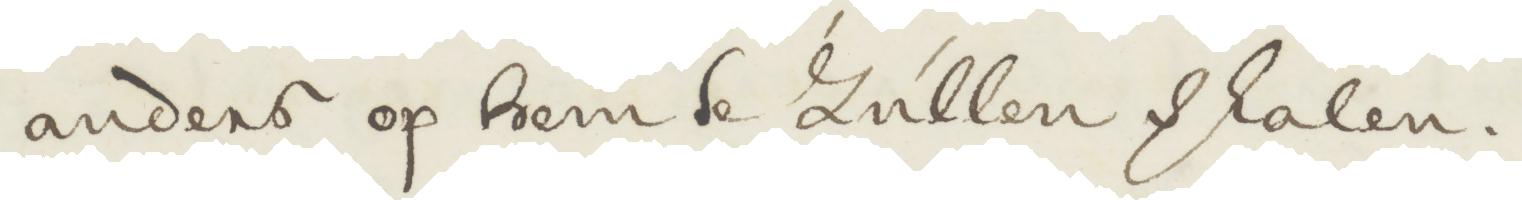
anders op hem te zullen verhalen.
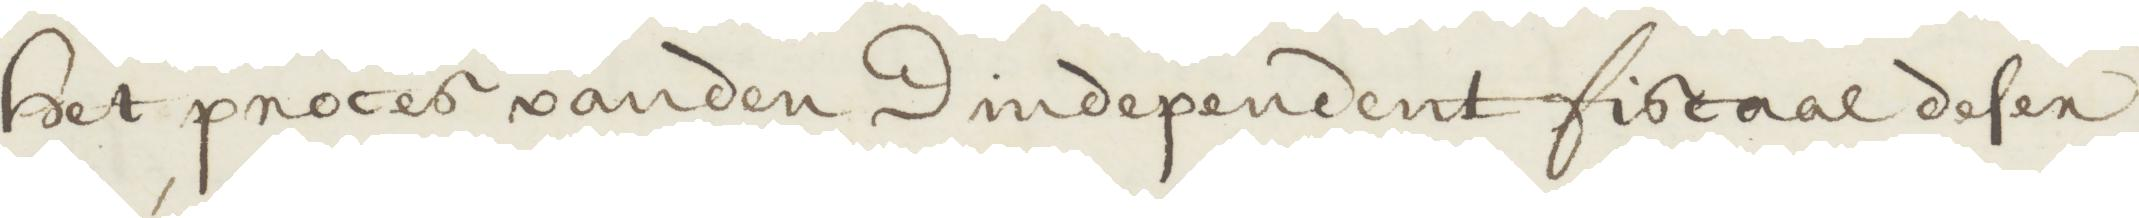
het proces van den E independent fiscaal deser
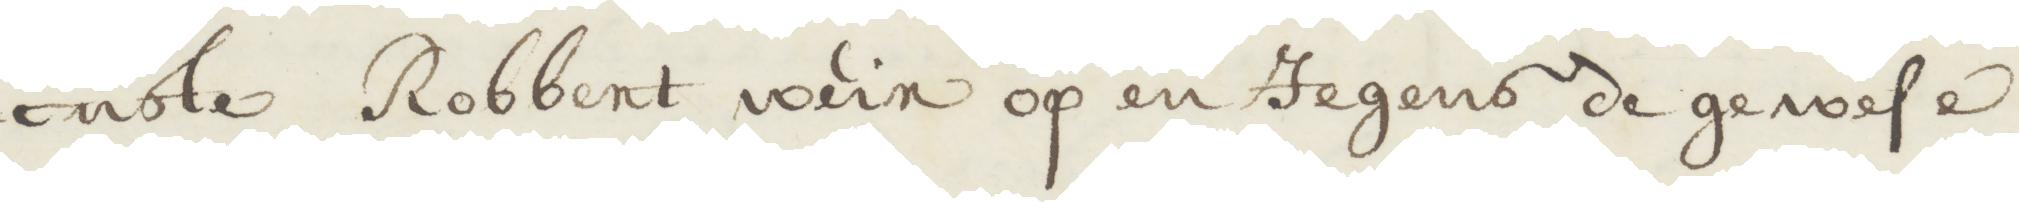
custe Robbert weir op en Iegens de gewese
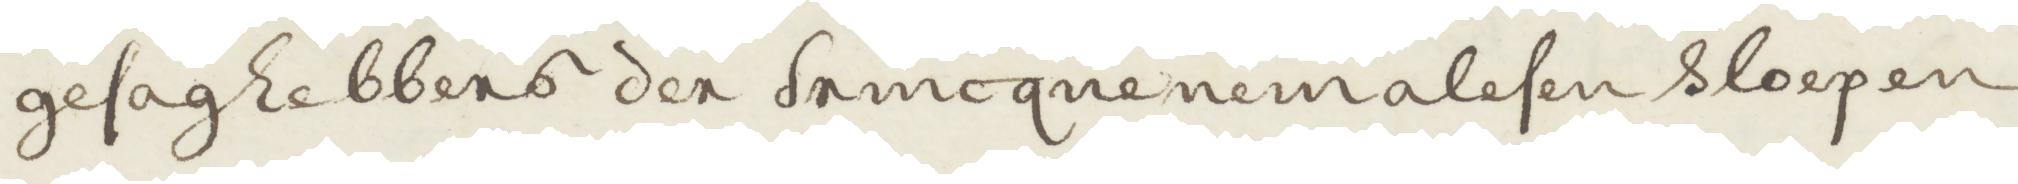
gesaghebbers der trincque nemalesen sloepen
